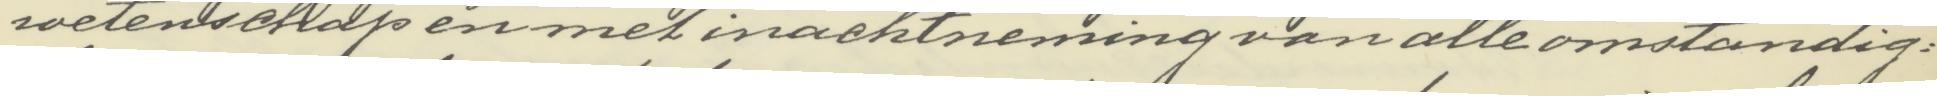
wetenschap en met inachtneming van alle omstandig=
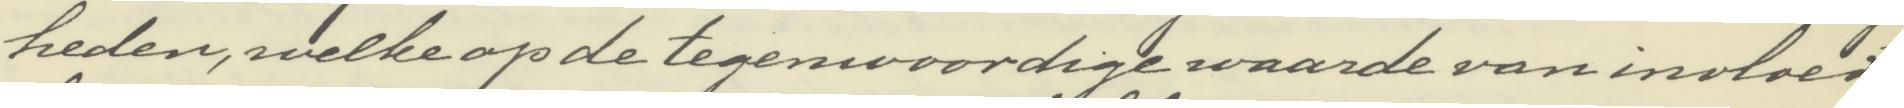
heden, welke op de tegenwoordige waarde van invloed
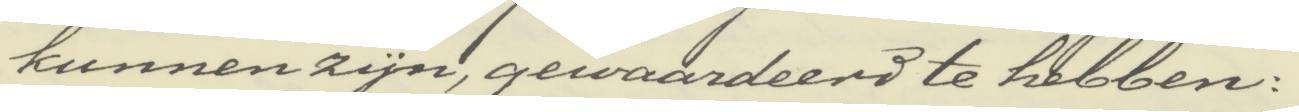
kunnen zijn, gewaardeerd te hebben:
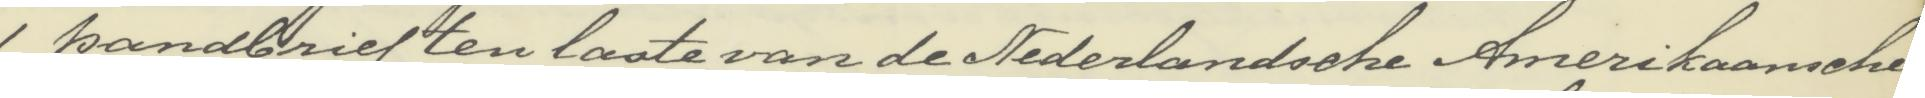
1 pandbrief ten laste van de Nederlandsche Amerikaansche
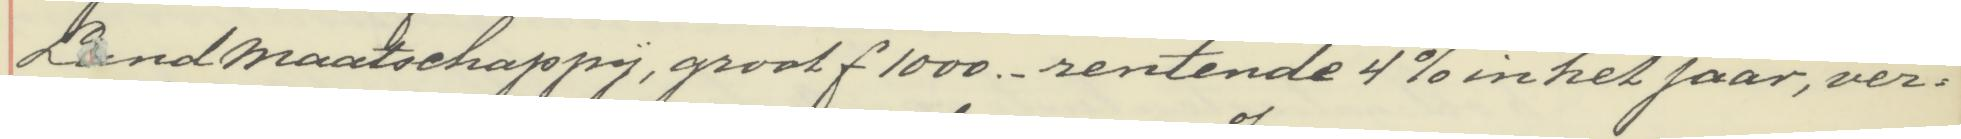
Land Maatschappij, groot ƒ 1000.- rentende 4% in het jaar, ver=
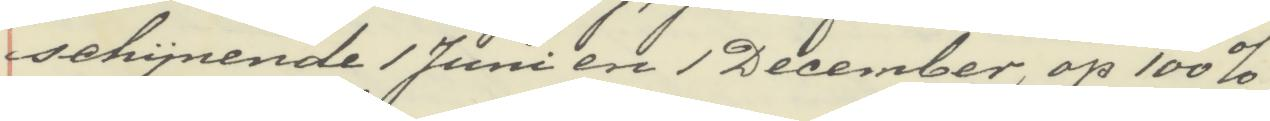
schijnende 1 Juni en 1 December, op 100%
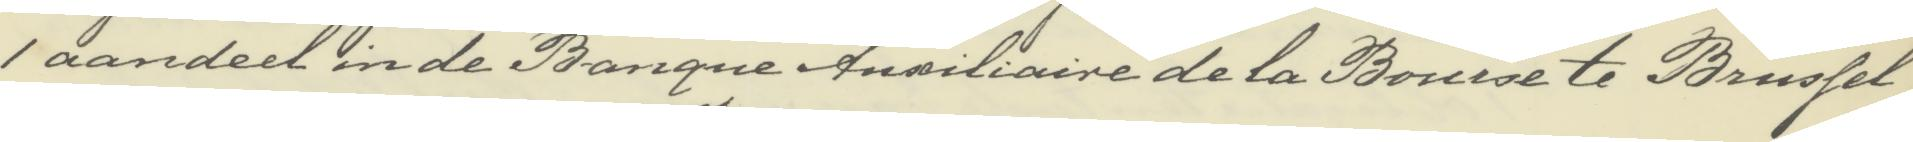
1 aandeel in de Banque Auxiliaire de la Bourse te Brussel
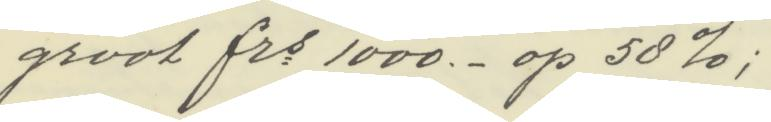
groot fr=s 1000.- op 58%;
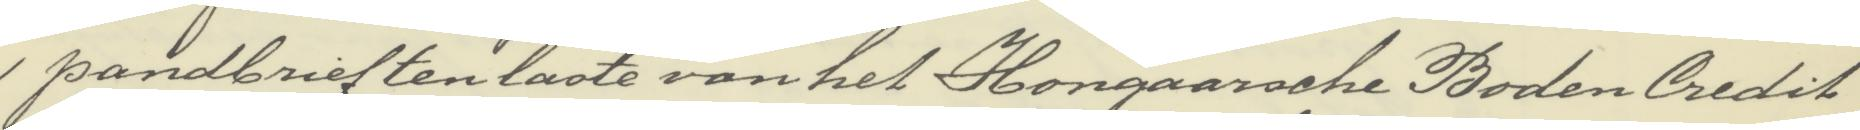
1 pandbrief ten laste van het Hongaarsche Boden Credit
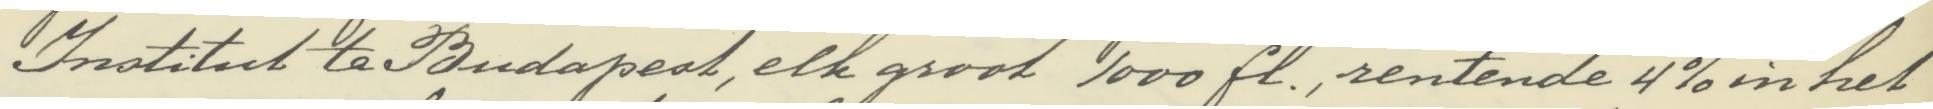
Institut te Budapest, elk groot 1000 fl., rentende 4% in het
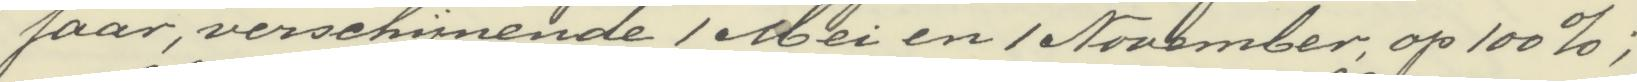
jaar, verschijnende 1 Mei en 1 November, op 100 %;
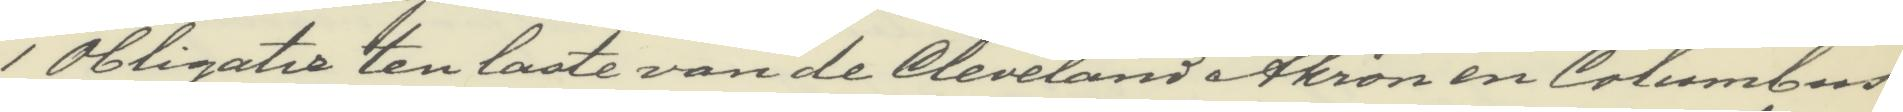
1 obligatie ten laste van de Cleveland Akron en Columbus
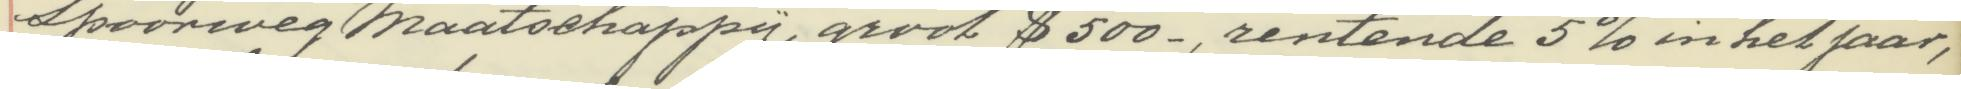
Spoorweg Maatschappij, groot ƒ 500 -, rentende 5% in het jaar,
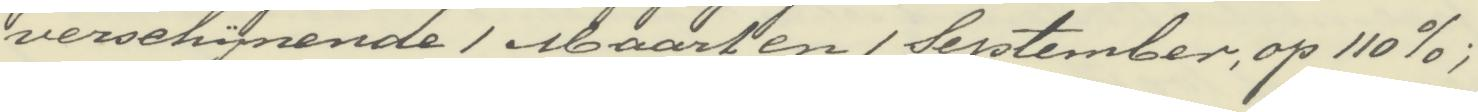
verschijnende 1 Maart en 1 September, op 110%;
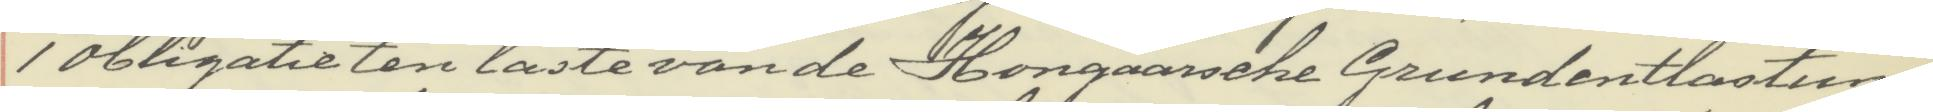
1 obligatie ten laste van de Hongaarsche Grundentlastung
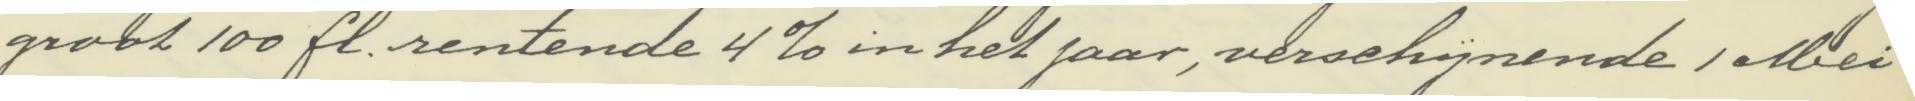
groot 100 fl. rentende 4% in het jaar, verschijnende 1 Mei
